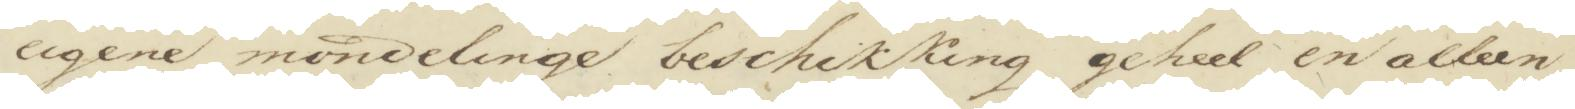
eigene mondelinge beschikking geheel en alleen
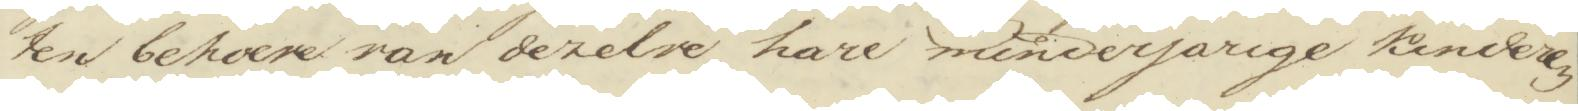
ten behoeve van dezelve hare minderjarige kinderen
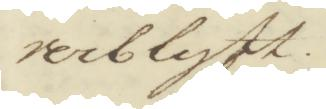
verblyft.
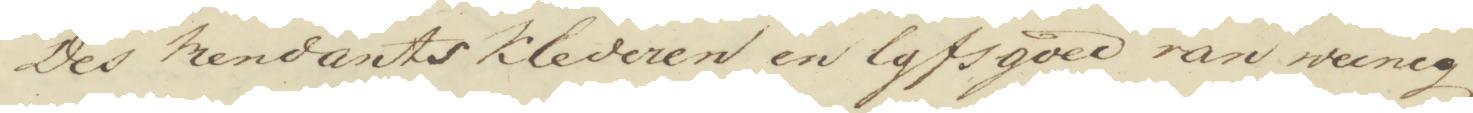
Des Rendants klederen en lyfsgoed van weinig
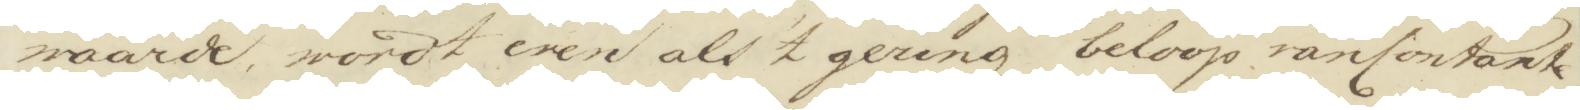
waarde, wordt even als 't gering beloop van Contante
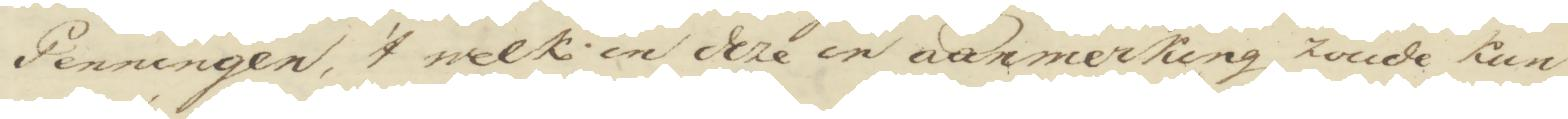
Penningen, ’t welk in deze in aanmerking zoude kun
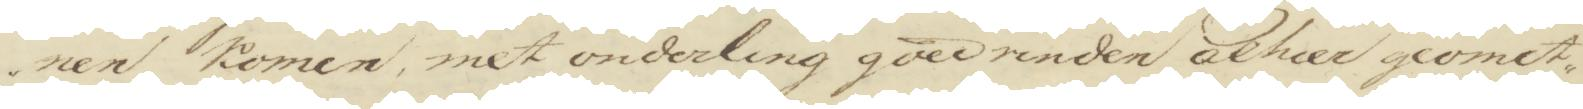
„nen komen, met onderling goedvinden alhier geomit„
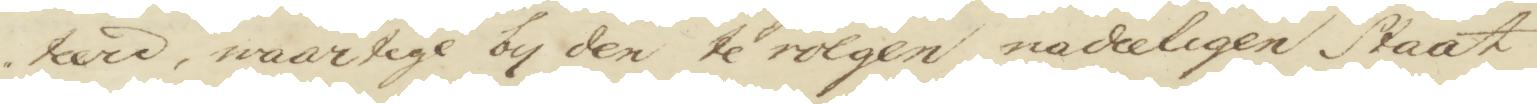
„teerd, waar tege by den te volgen nadeeligen staat
